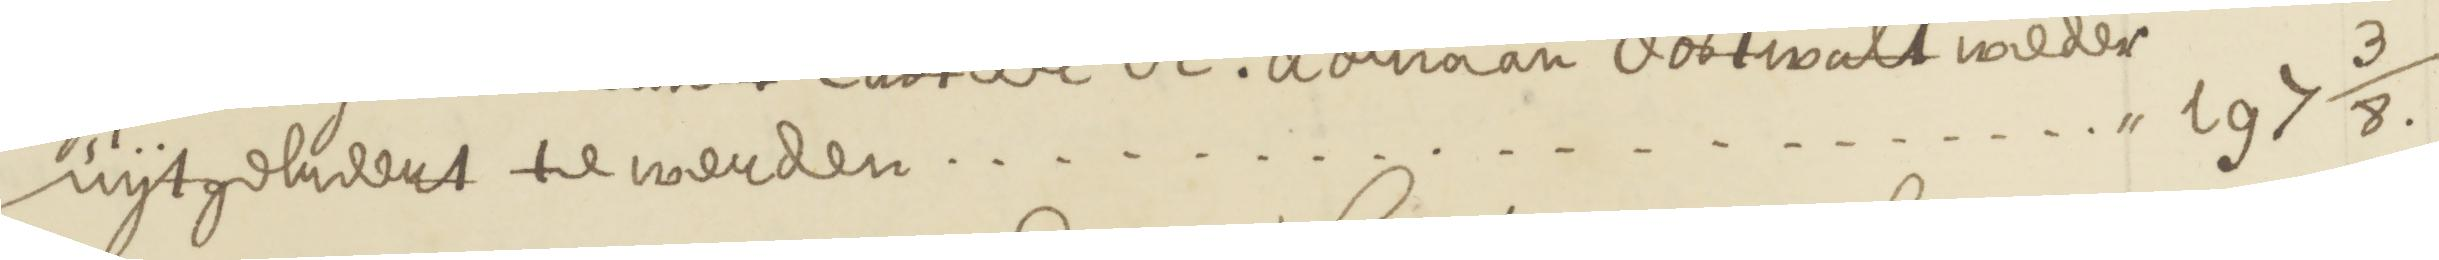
uijtgekeert te werden. . . . . . . . . . . . . . . . . . . . . „ 197 3/8.
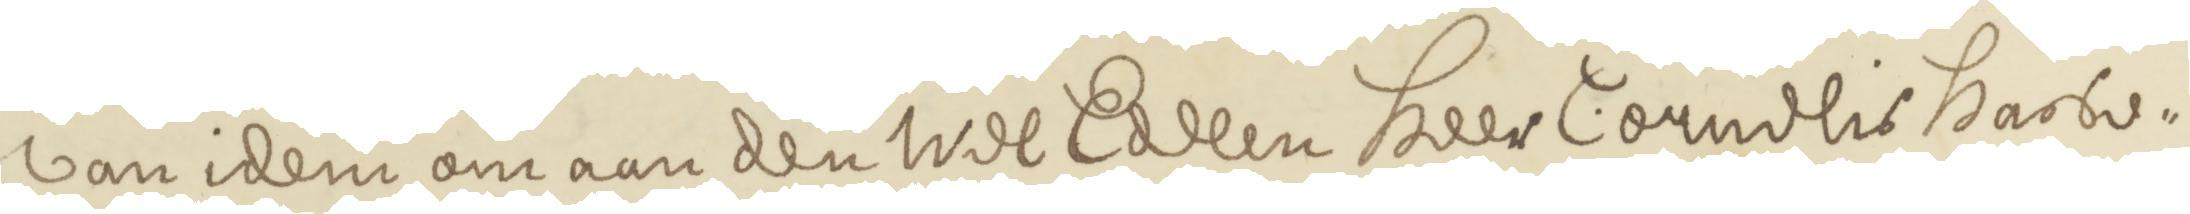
van idem om aan den wel Edelen Heer Cornelis Hasse„
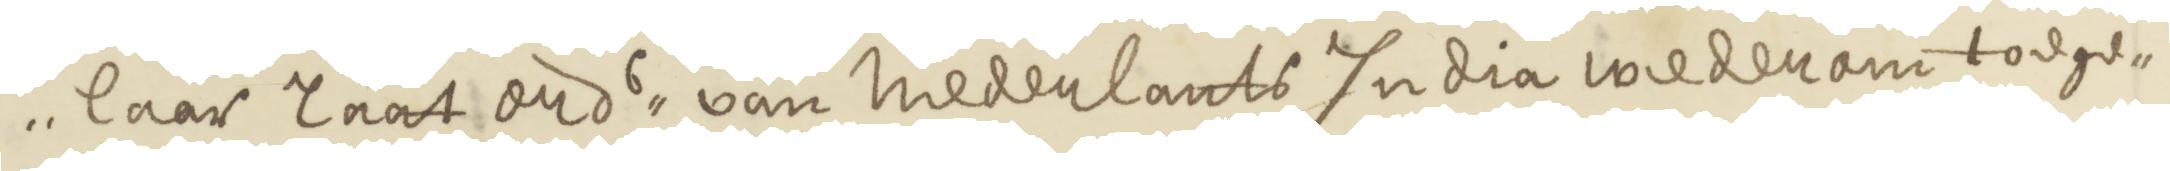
„laar Raat ord„s van nederlants Jndia wederom toege„
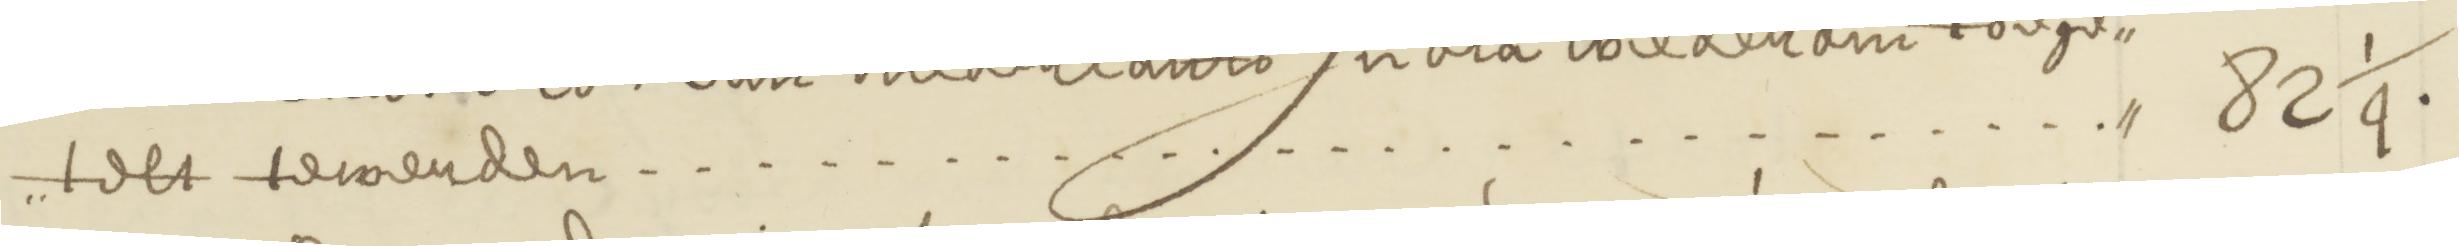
„telt te werden. . . . . . . . . . . . . . . . . . . . . . . . . „ 82¼.
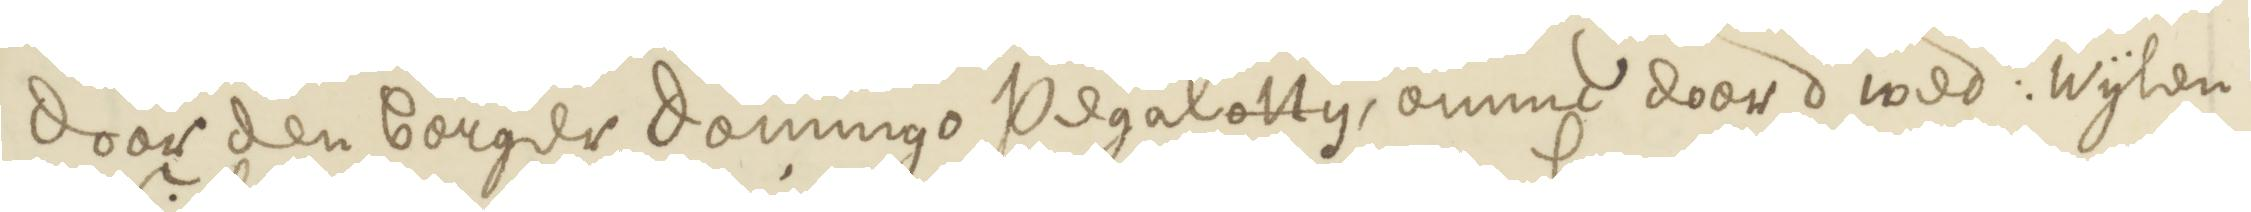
door den borger domingo Pegalottij, omme door d’ wed:e wijlen
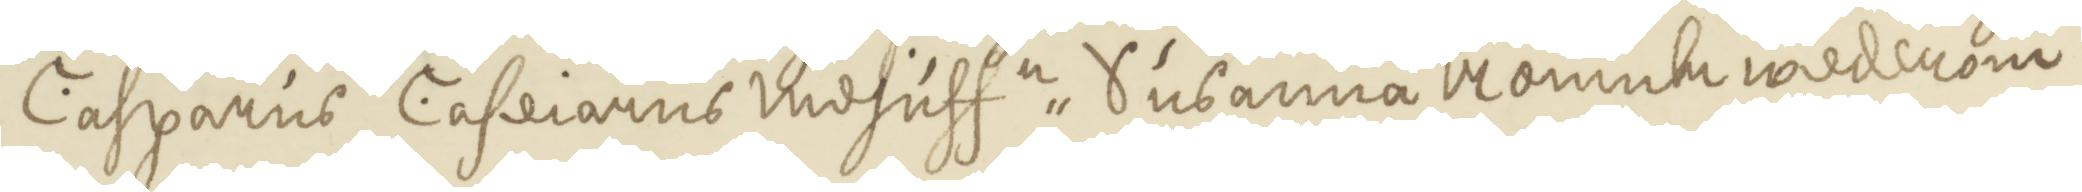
Casparus Caseliarus Mejuff„r Susanna Konink wederom
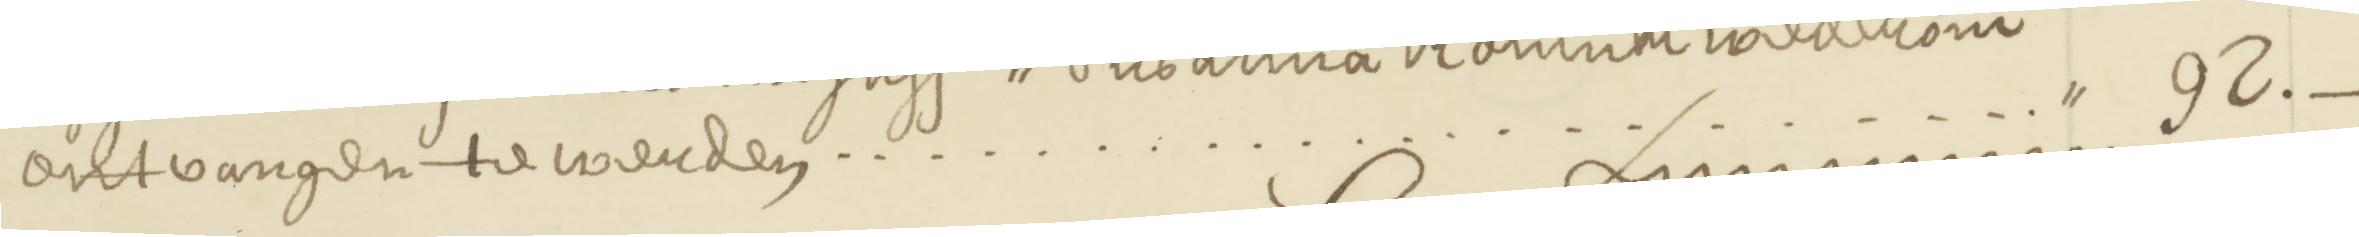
ontvangen te werden. . . . . . . . . . . . . . . . . . . . . . . . „ 92.—
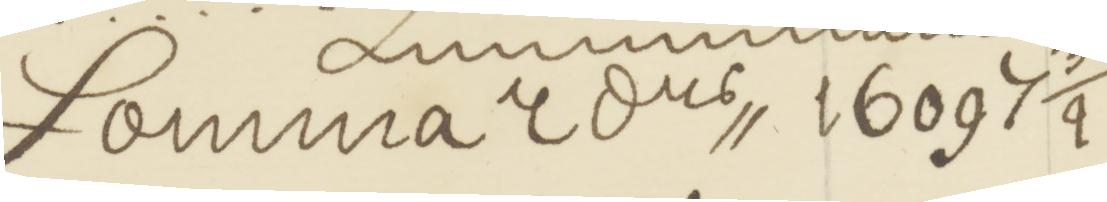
Somma rd„rs 16097¾.
